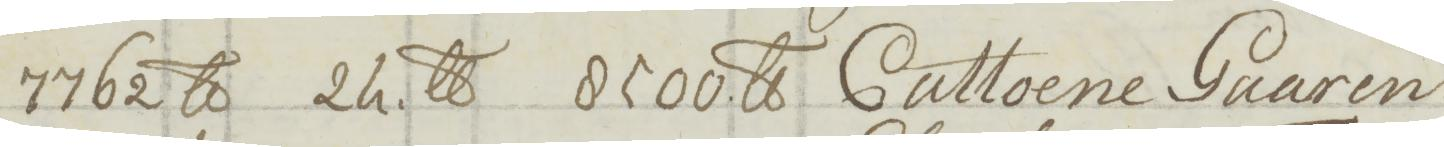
7762 lb 24. lb 8500.lb Cattoene Gaaren
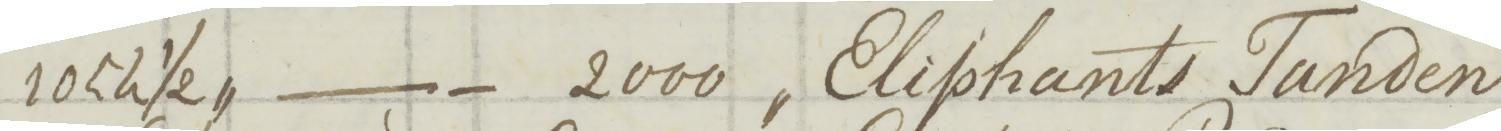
1054½— - „ 2000 „ Eliphants Tanden
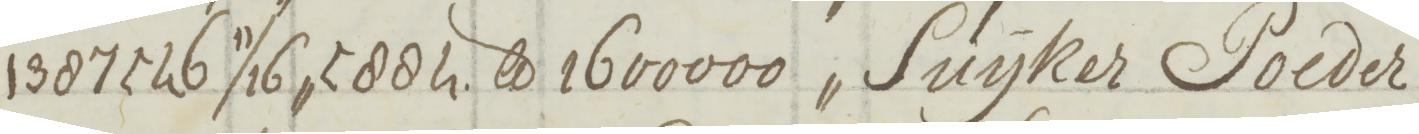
1387546 11/16 „ 5884. lb 1600000 „ Suijker Poeder
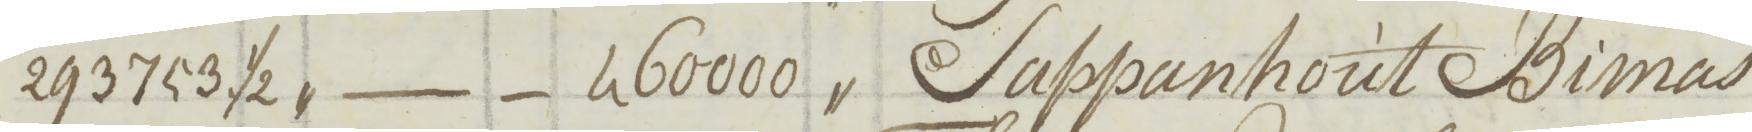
293753½ „ 460000 „ Sappanhout Bimas
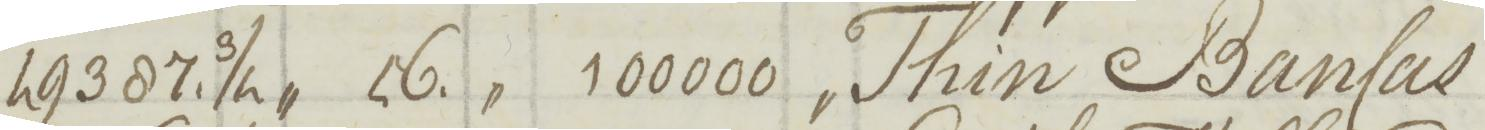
49387.¾„ 56. „ 100000 „Thin Bancas
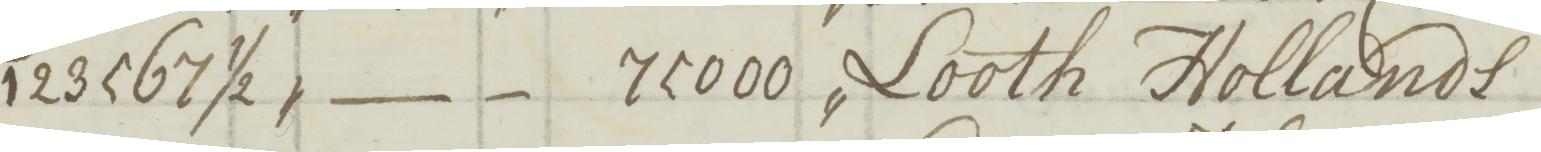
123567½ „ 75000 „ Looth Hollands
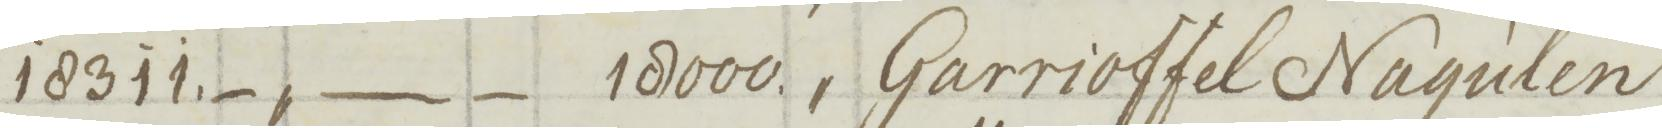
18311.—„ 18000.„ Garrioffel Nagulen
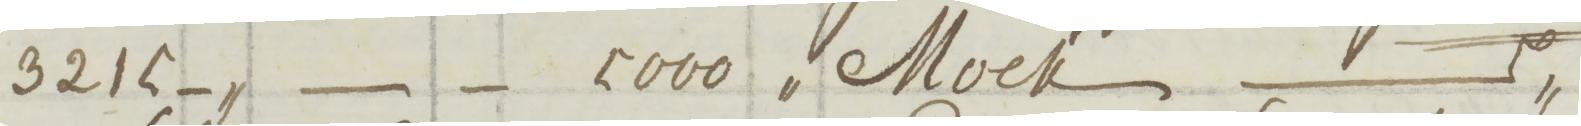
3215—„ 5000 „ Moer _„o
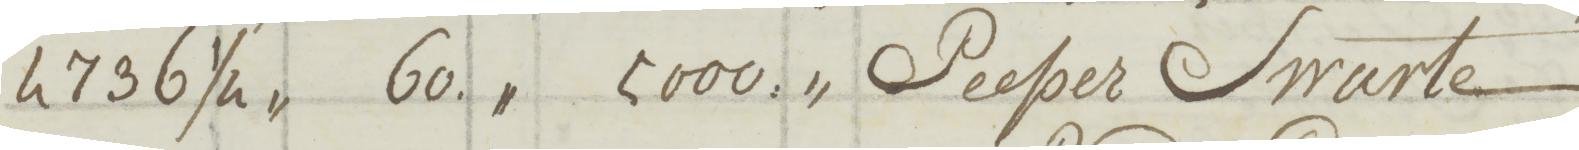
4736¼„ 60.„ 5000:„ Peeper Swarte
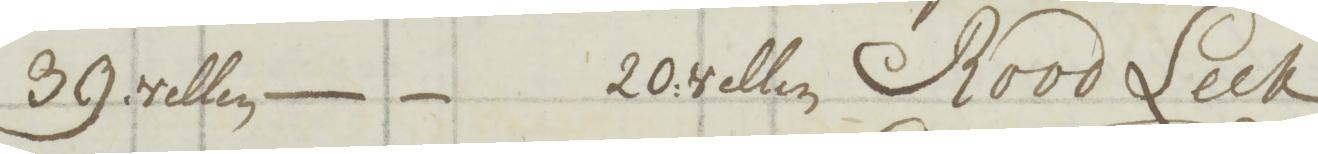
39. vellen 20: vellen Rood Leer
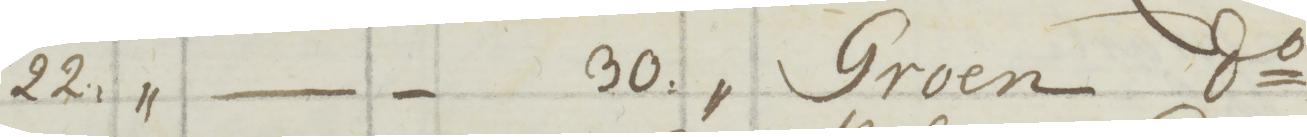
22: „ 30: „ Groen d=o
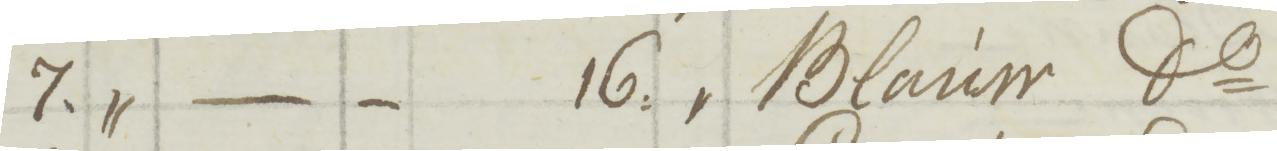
7.„ 16:„ Blauw d=o
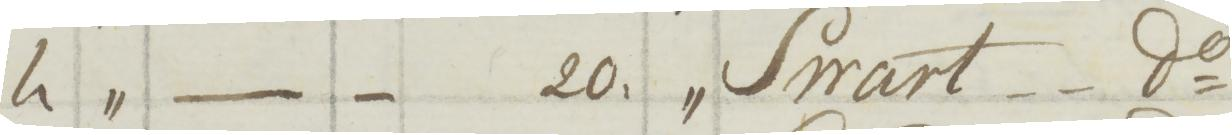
4„ 20:„ Swart d=o
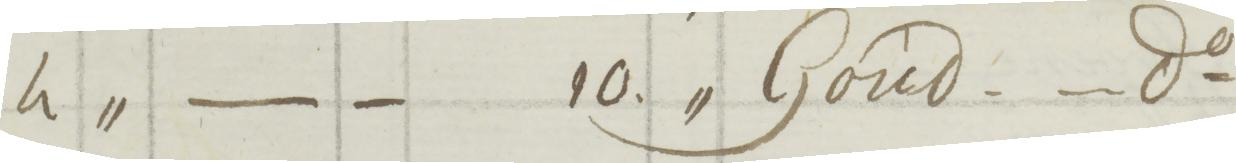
4„ 10.„ Goud d=o
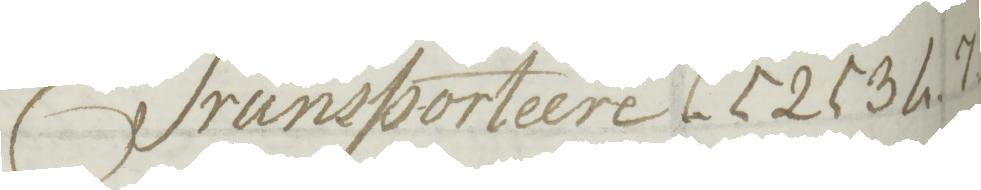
Transporteere ƒ 52534.7
